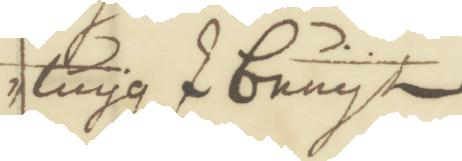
„tuijg verbruijt
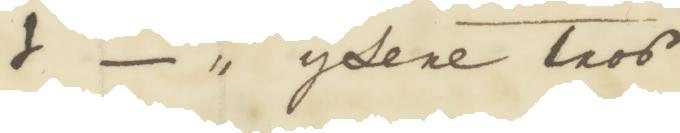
— 1 — „ ijsere tros - - - - - - - -
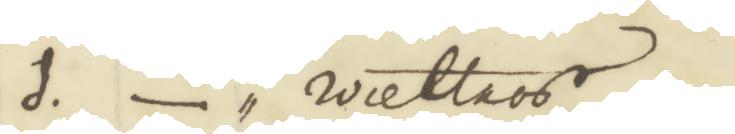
— 1. — „ wieltros - - - - - - - - -
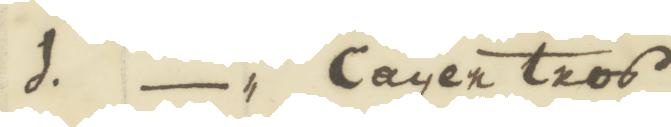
— 1. — „ caijer tros - - - - - - -
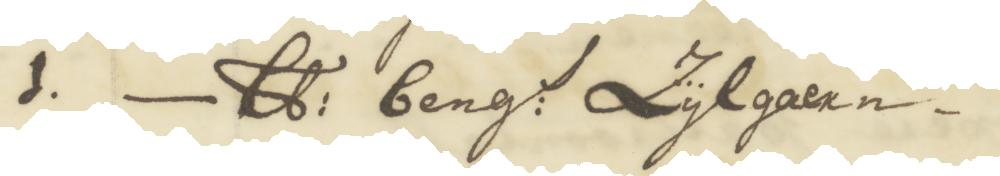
— 1. — lb: beng:s zijlgaern - - - - -
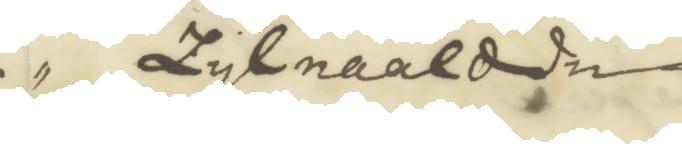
— 2 — „ zijlnaalden - - - - - -
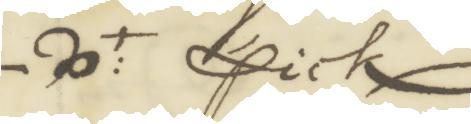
— —1/8 — v:t pick - - - - - - -
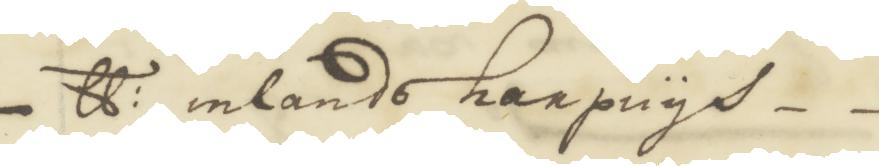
— 31¼ — lb: inlands harpuijs - - - - -
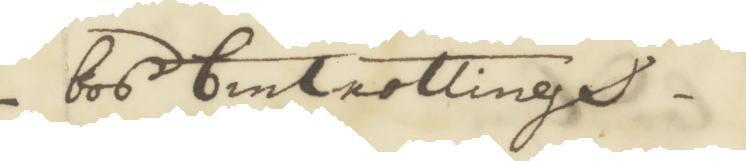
— 1. — bos bintrottings - - - - -
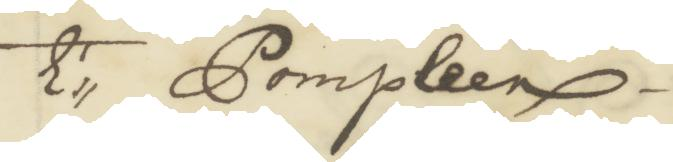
— —¼ — h„t Pompleer - - - - -
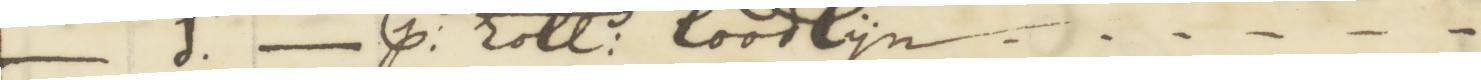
— 1. — p:s holl:s loodlijn - - - - - -
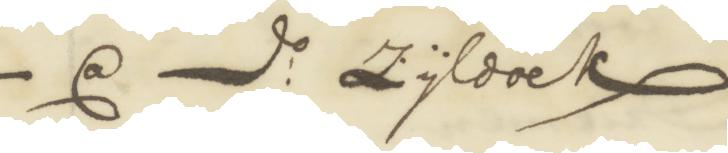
— 34. — @ _:o Zijldoek - - - - - -
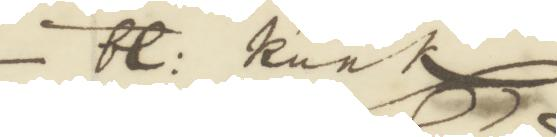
— 6. — lb: kurk - - - - - - - - -
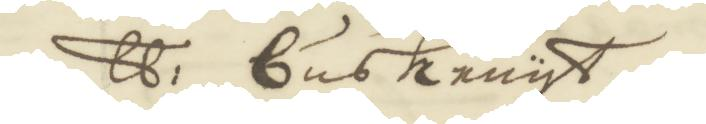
— 310. — lb: buskruijt - - - - - - - -
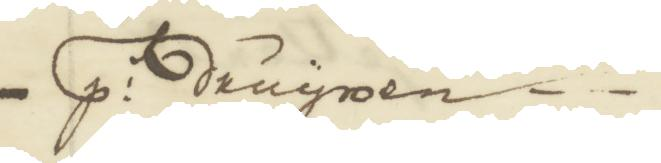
— 24. — p:s druijven - - - - - - - -
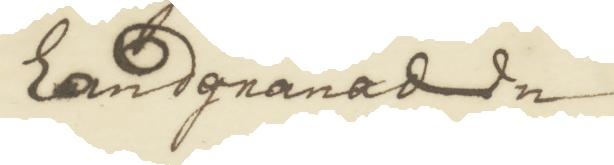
— 8. — „ handgranaden - - - - -
